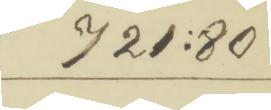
721:80
